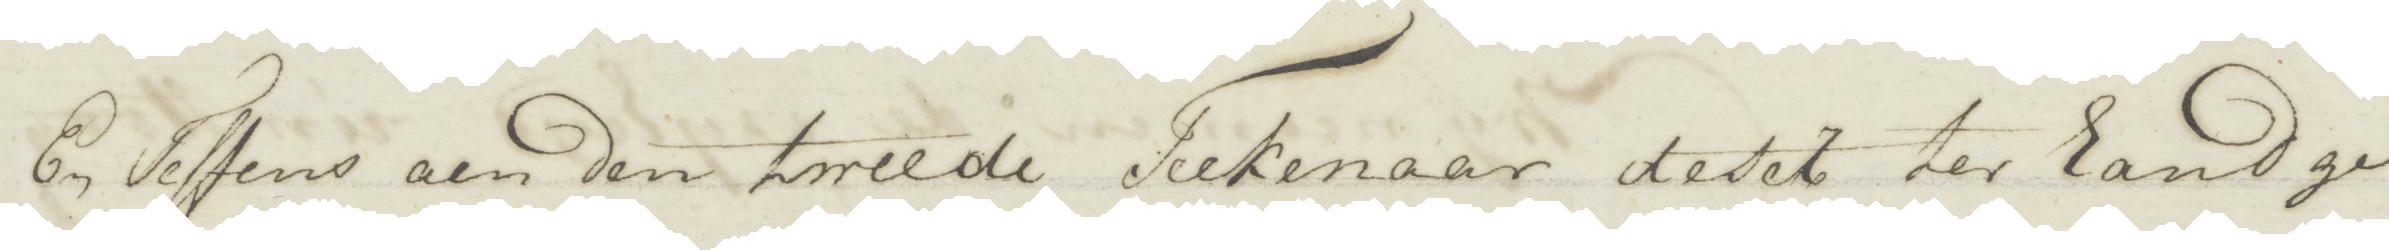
En Teffens aen den tweede Teekenaar deset ter hand ge
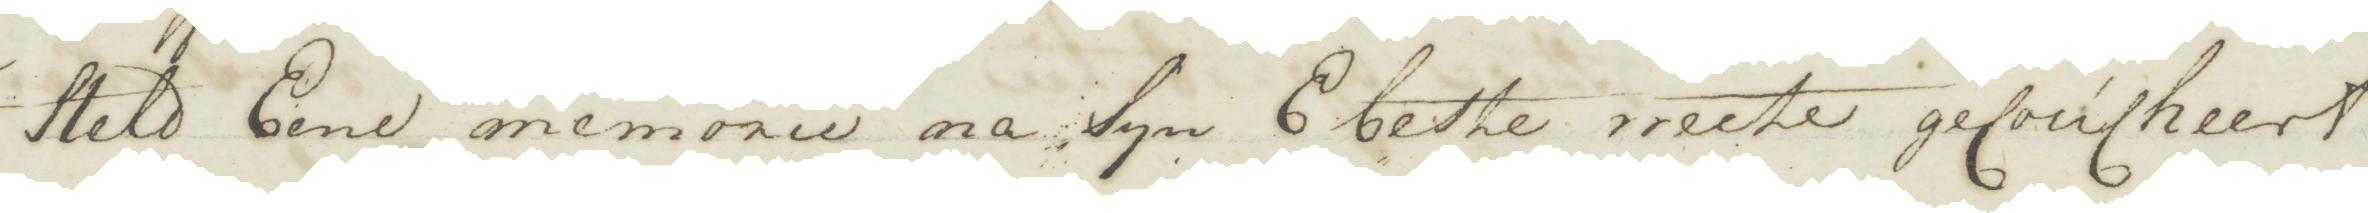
steld Eene memorie na syn E beste weete gecoucheert
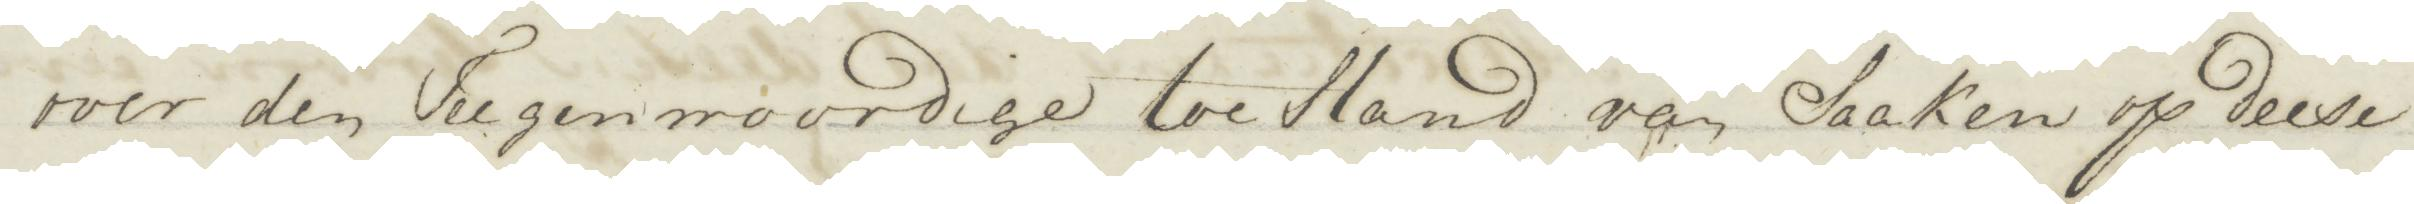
over den Teegenwoordige toestand van saaken op deese
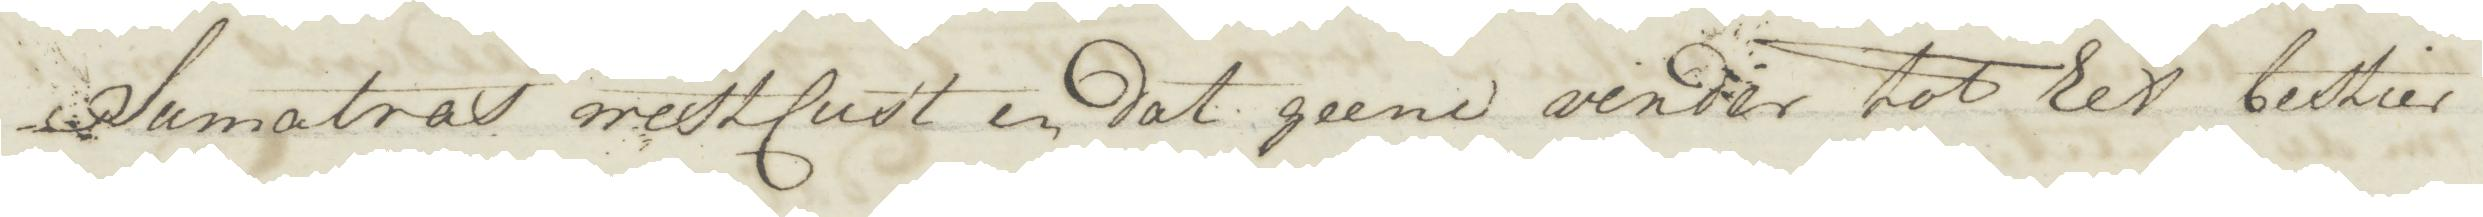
Sumatras westcust en dat geene verder tot het bestier
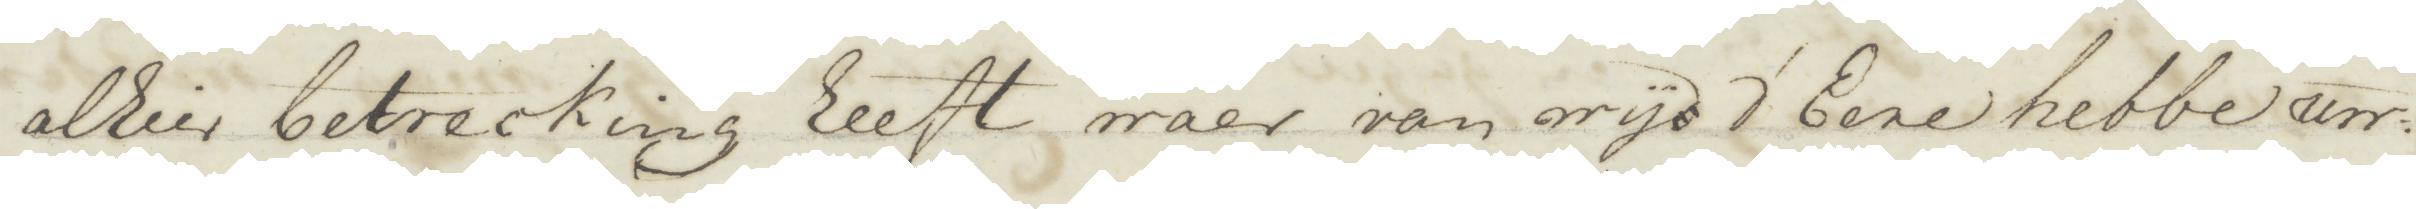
alhier betrecking heeft waer van wijd d' Eere hebbe uw:
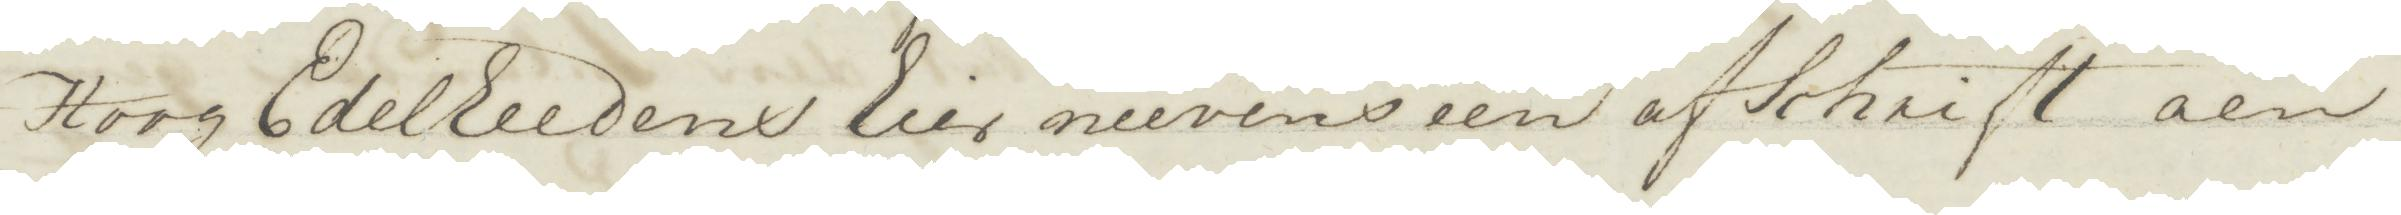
Hoog Edelheedens hier neevens een afschrift aen
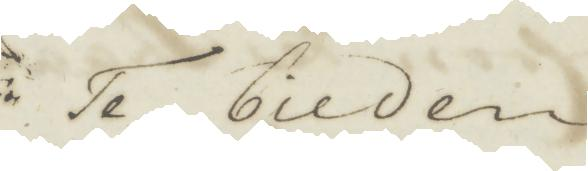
Te bieden
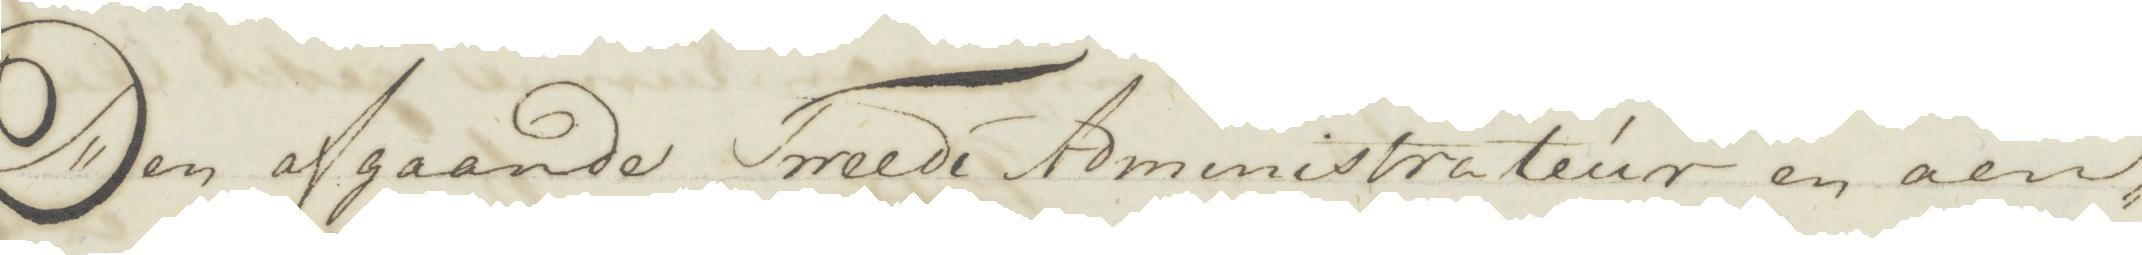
Den afgaande Tweede Administrateur en aen„
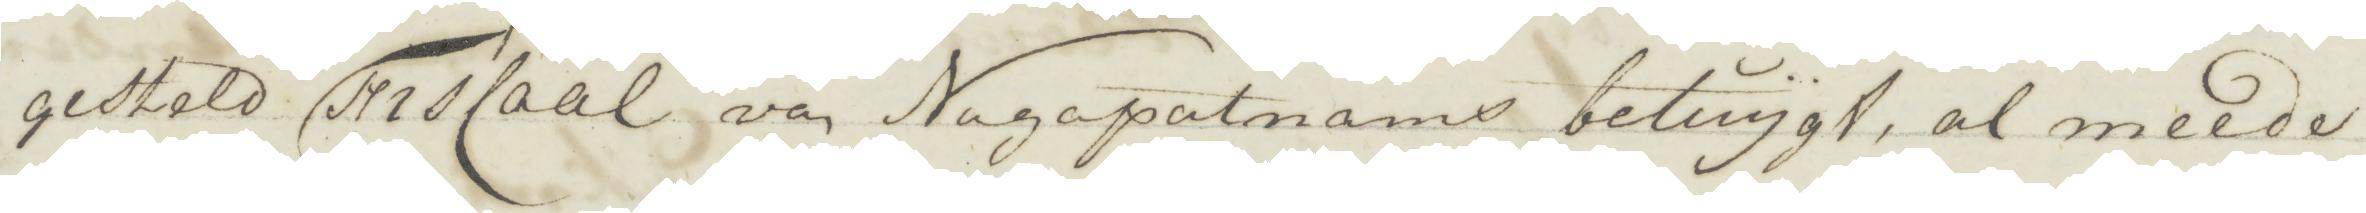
gesteld Fiscaal van Nagapatnams betuijgt, al meede
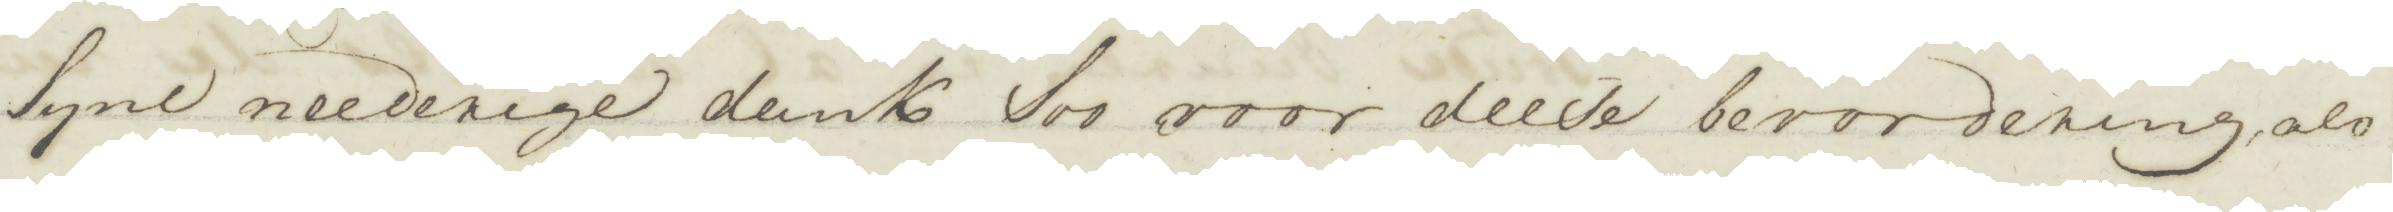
syne neederige dank soo voor deese bevordering, als
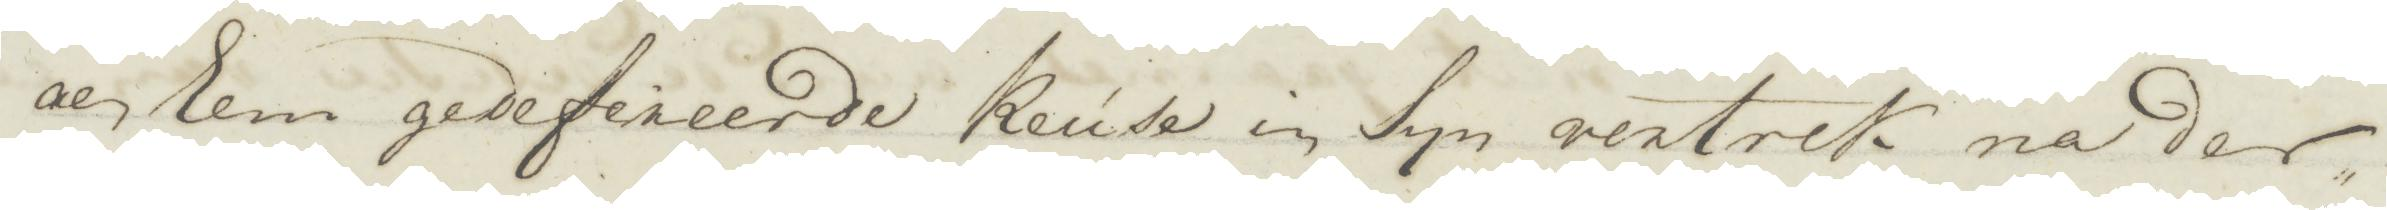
aen hem gedefereerde keuse in syn vertrek na der„
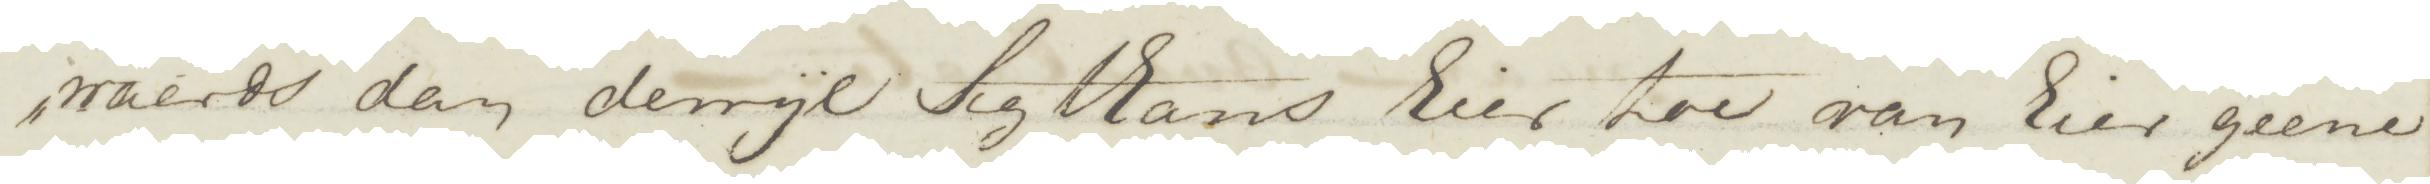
„waerds dan dewijl sig thans hier toe van hier geene
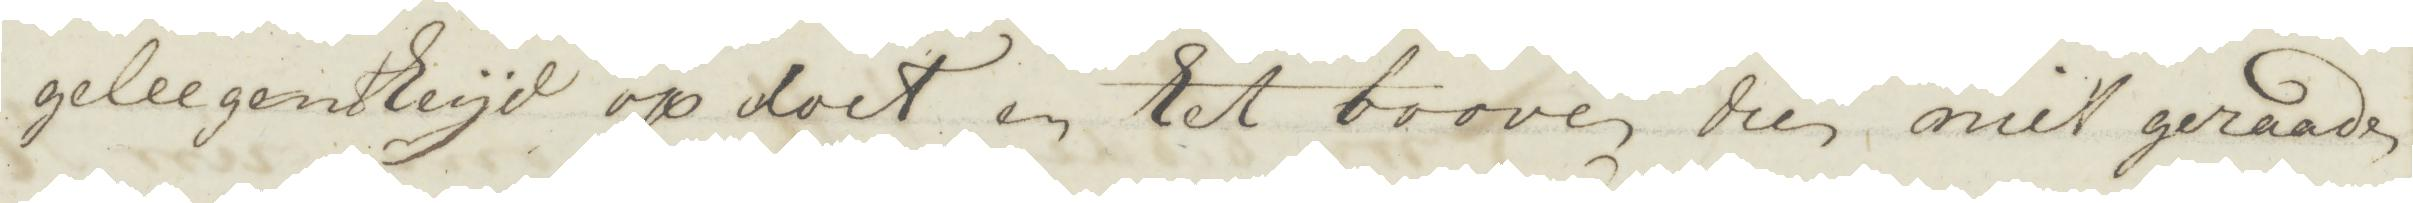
geleegentheijd 'op doet en het booven dien niet geraaden
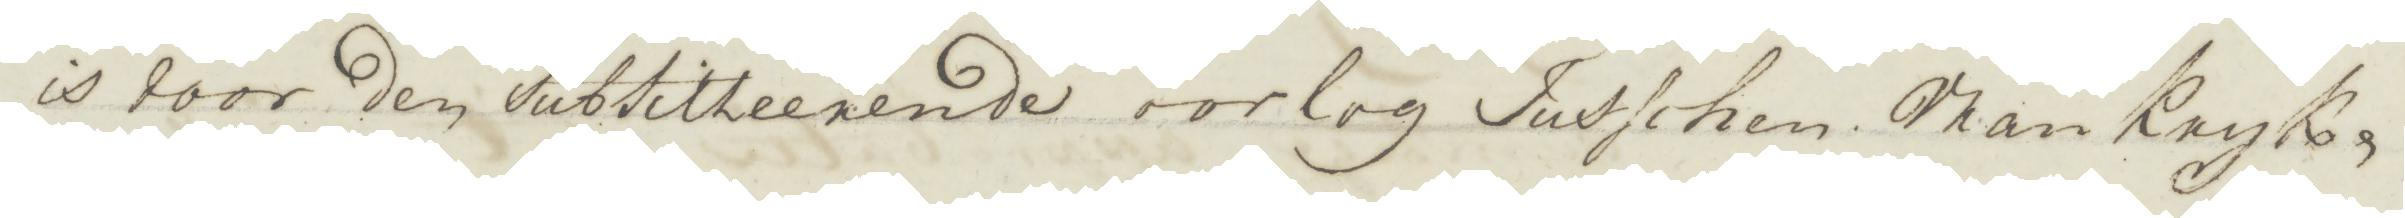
is door den subsitteerende oorlog Tusschen Vrankryk en
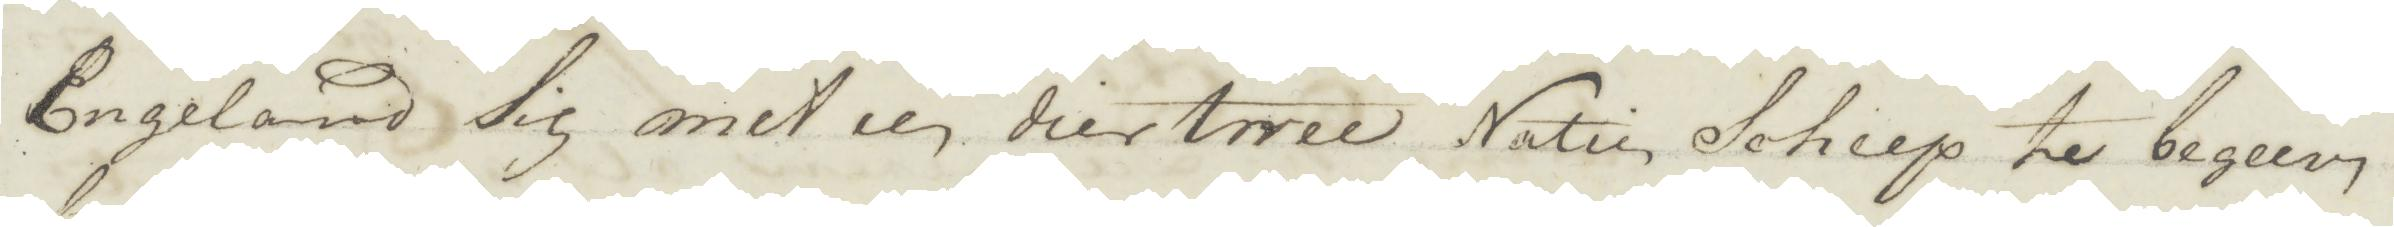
Engeland sig met een dier twee Natien scheep te begeeven
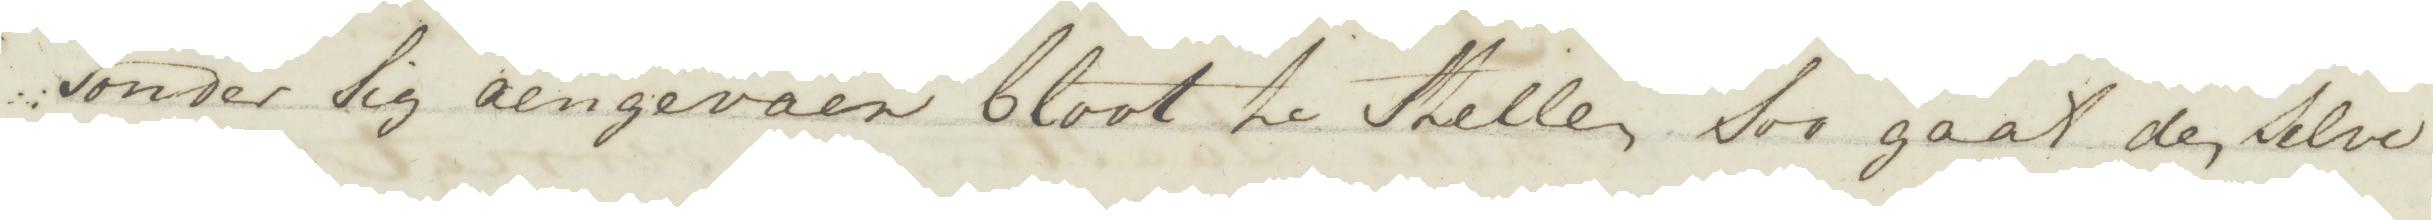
sonder sig aen gevaer bloot te stellen soo gaat den selve
